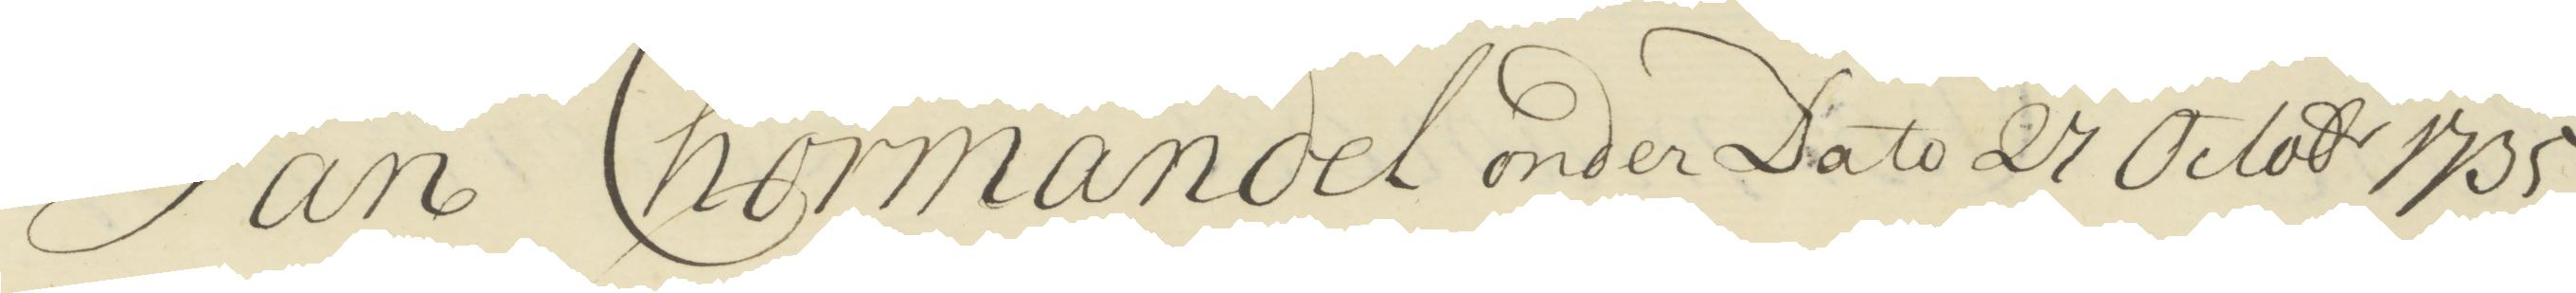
Van Chormandel onder Dato 27 Octob:r 1735
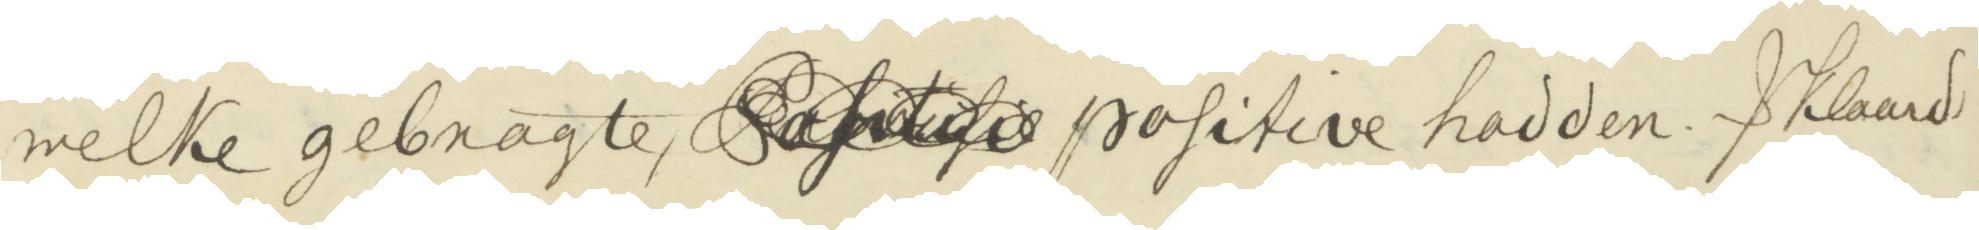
welke gebragte, Positiefe positive hadden. verklaard
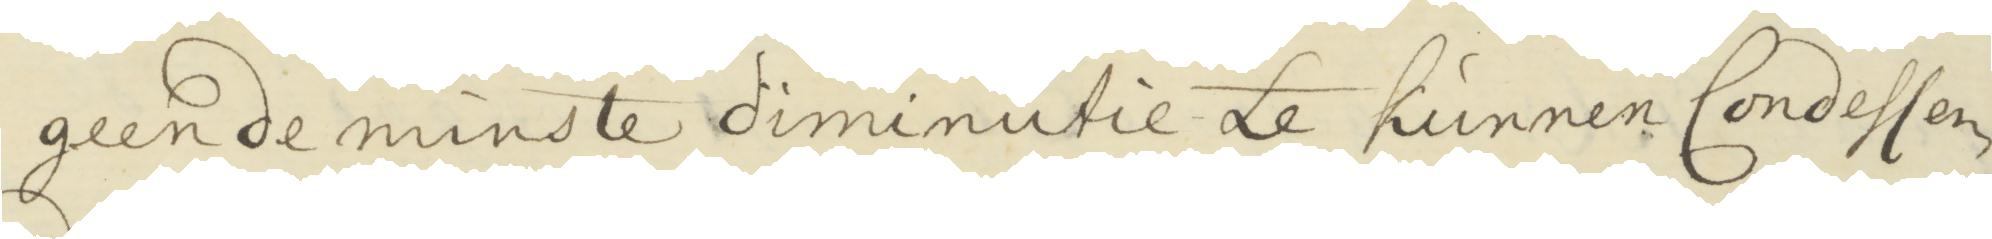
geen de minste diminutie te kunnen Condessen
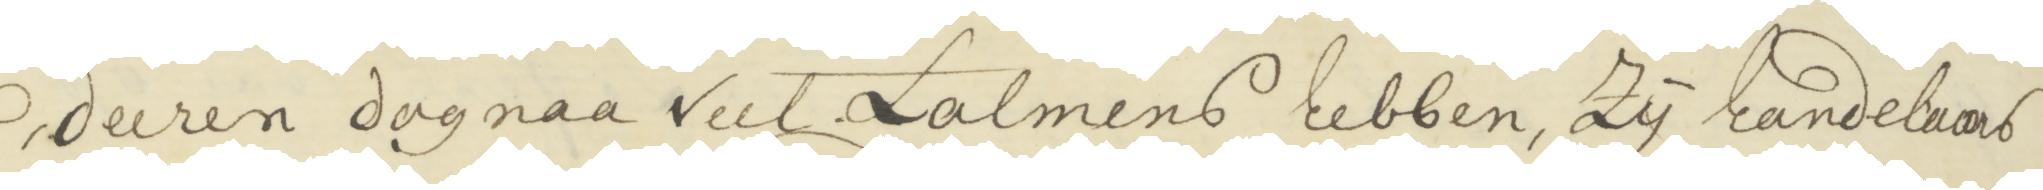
,deeren dog naa veel talmens hebben, Zij handelaars
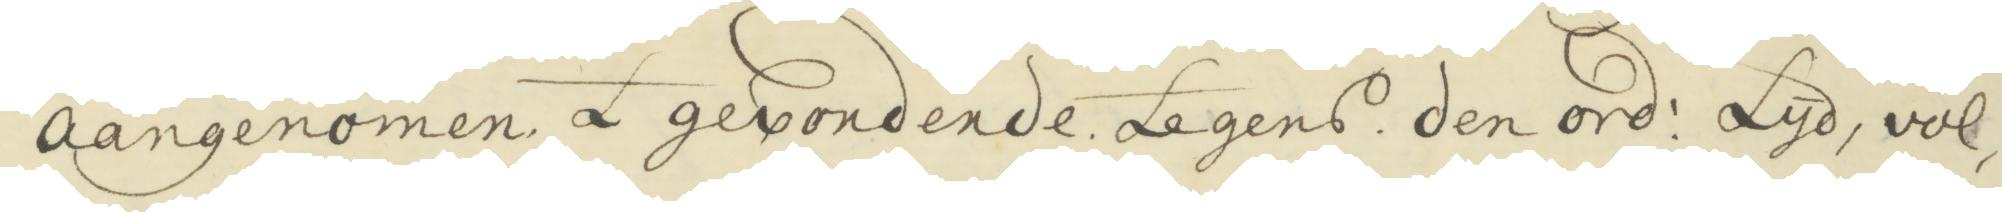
aangenomen, t gevorderde tegens den ord: tijd, vol„
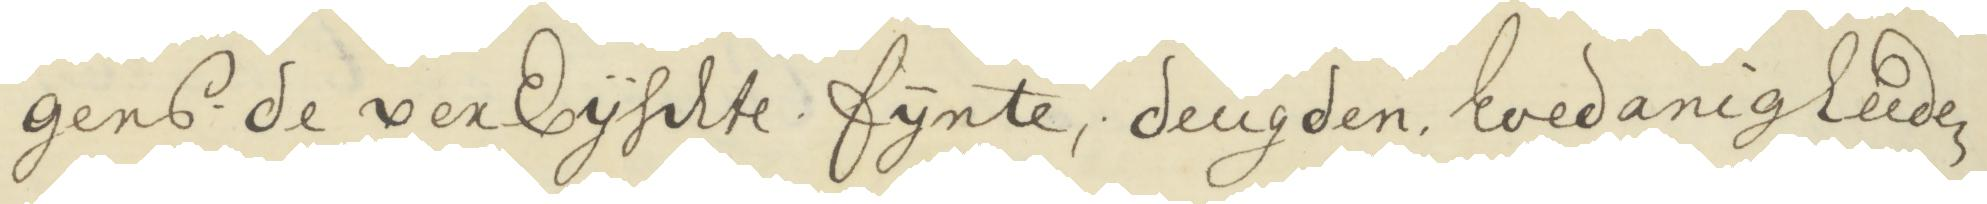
gens de vereijschte fijnte, deugden hoedanigheeden
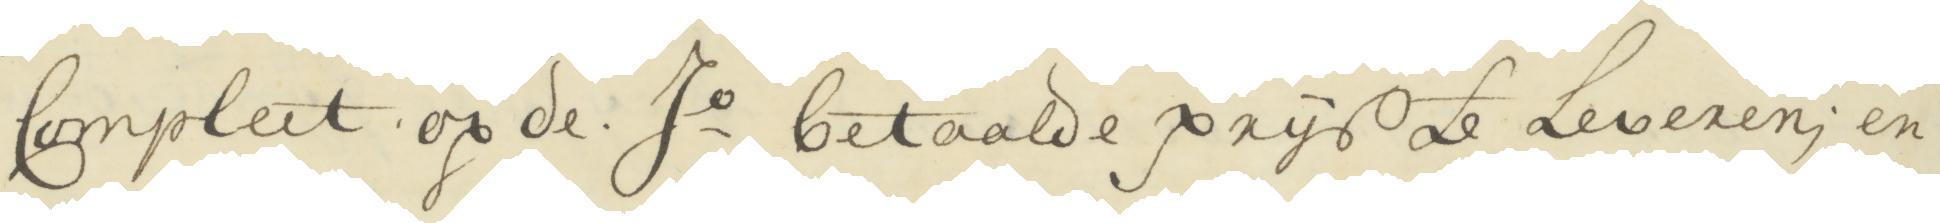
Compleet op de J=o betaalde prijs te Leveren; en
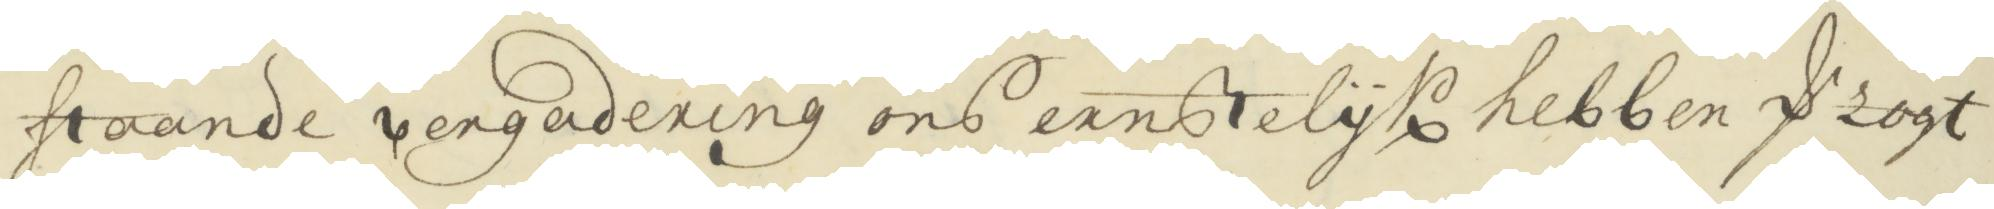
staande vergadering ons ernstelijk hebben verzogt
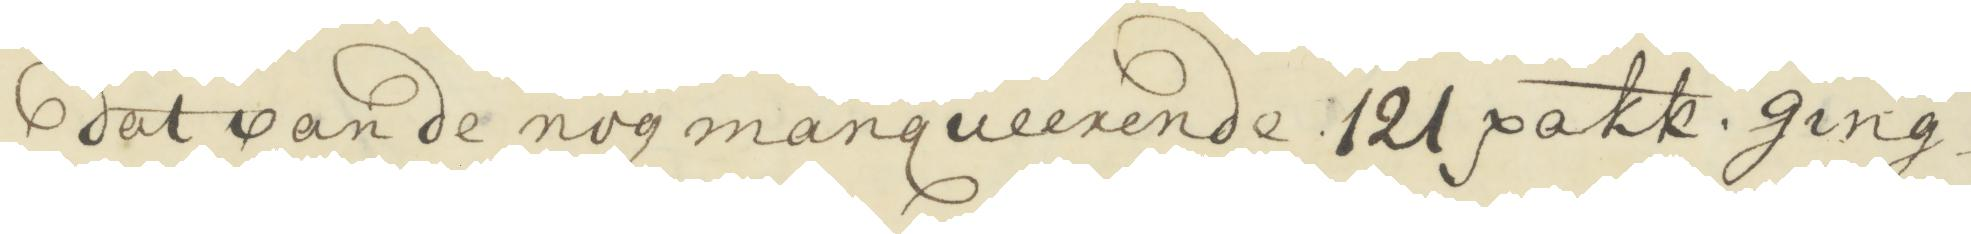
dat van de nog manqueerende 121 pakk. ging
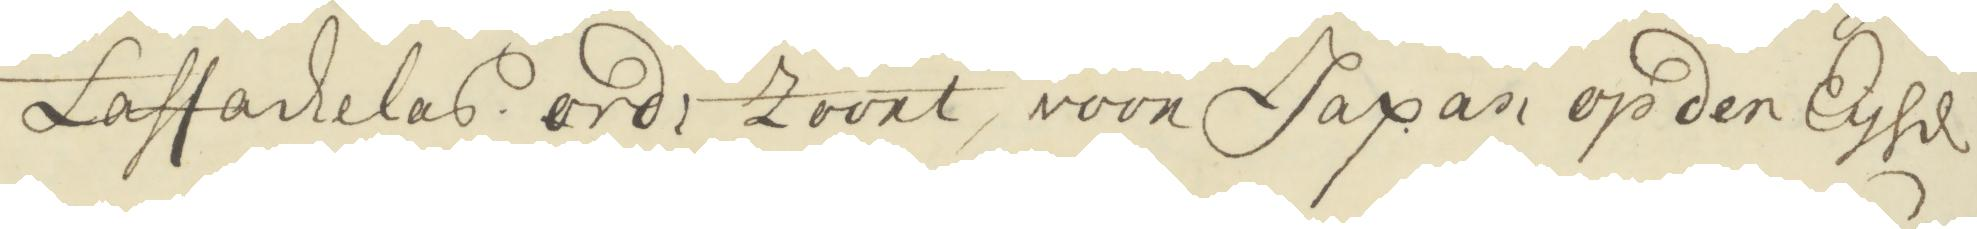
taffachelas ord: Zoort, voor Japan op den Eijsch
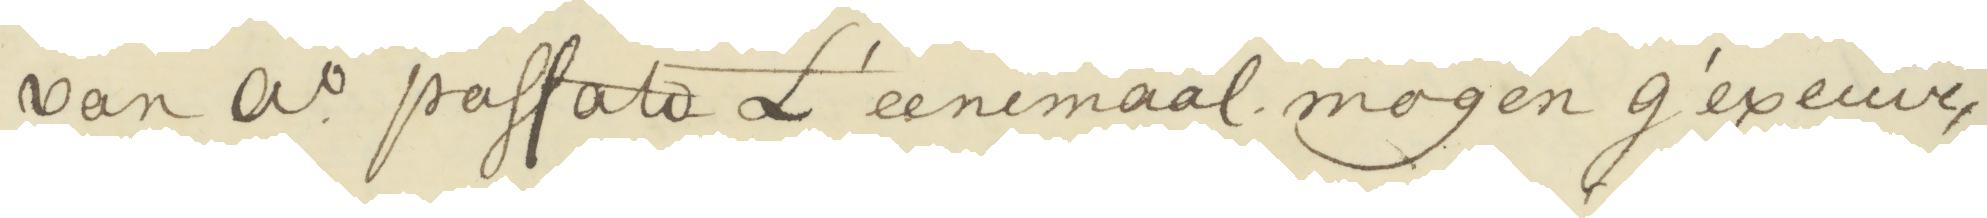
van a:o passato t' eenemaal mogen g’ execur„
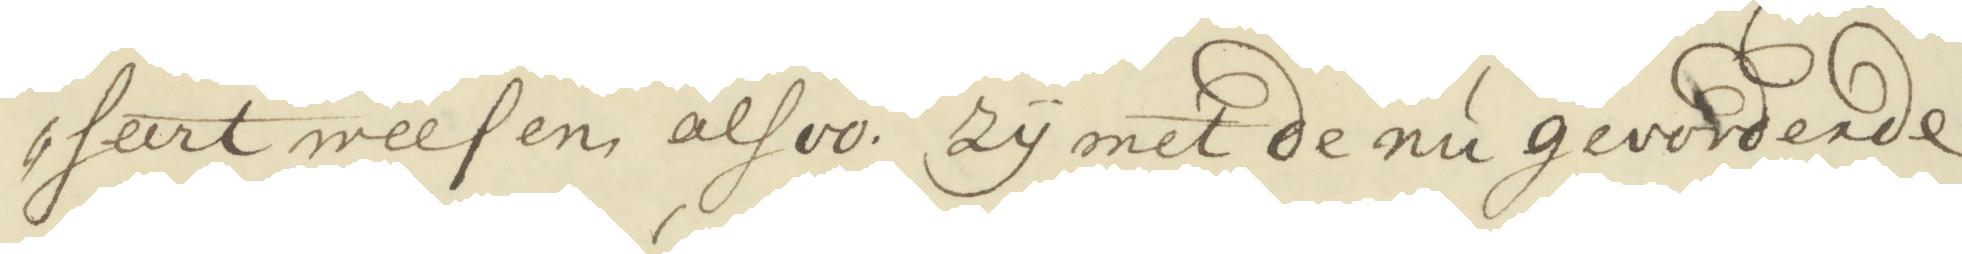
„seert weesen alsoo zij met de nu gevorderde
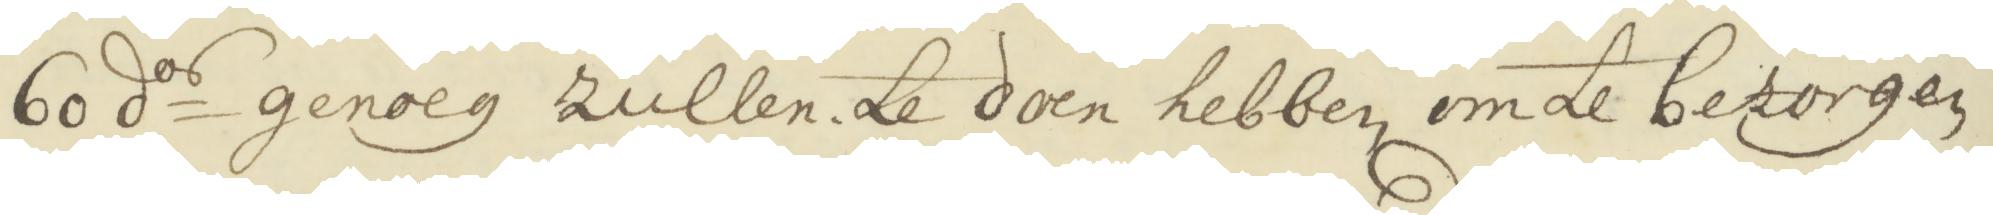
60 d=os genoeg zullen te doen hebben om te bezorgen
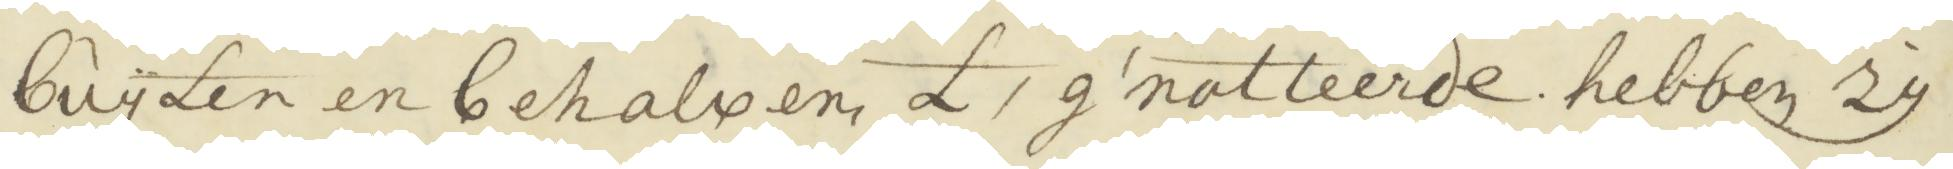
buijten en behalven t' g’notteerde hebben zij
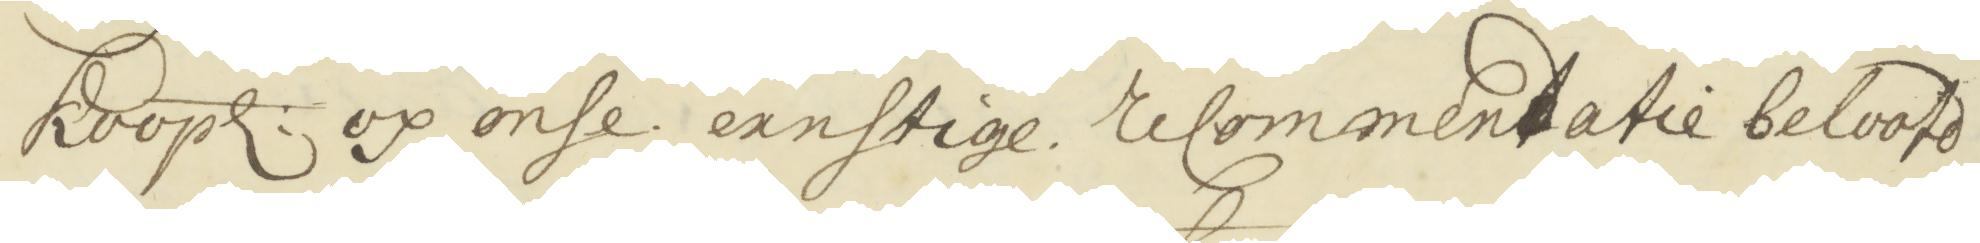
koopl: op onse ernstige recommendatie beloofd
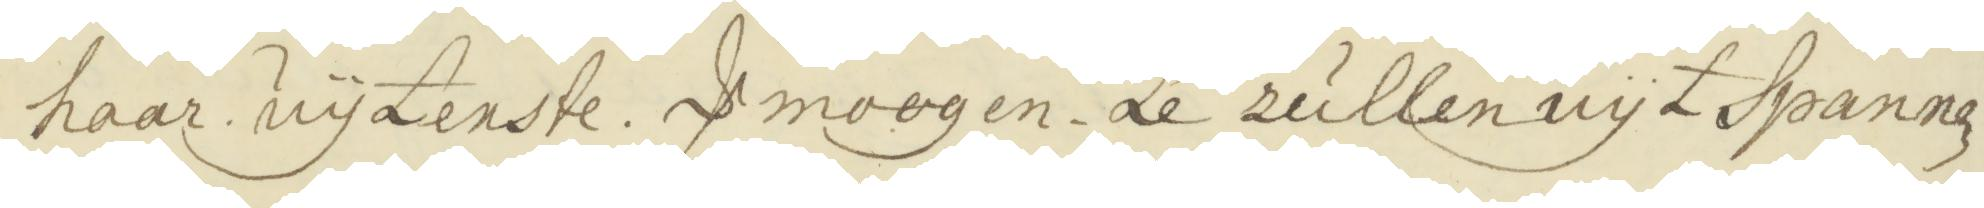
haar uijterste vermoogen te zullen uijt Spannen
